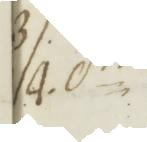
3/4 d=m
